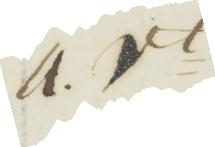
4. v=t
